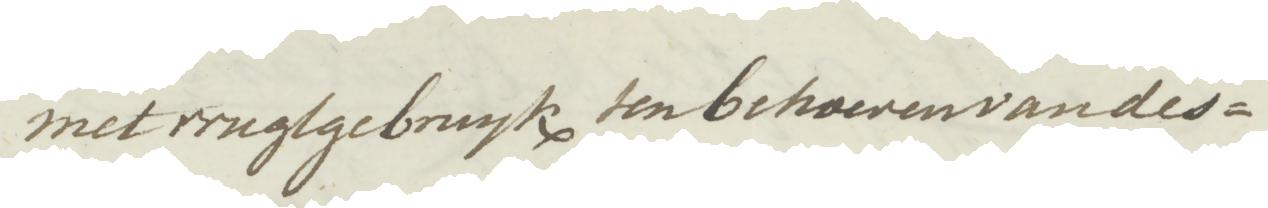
met vrugtgebruyk ten behoeven van des=
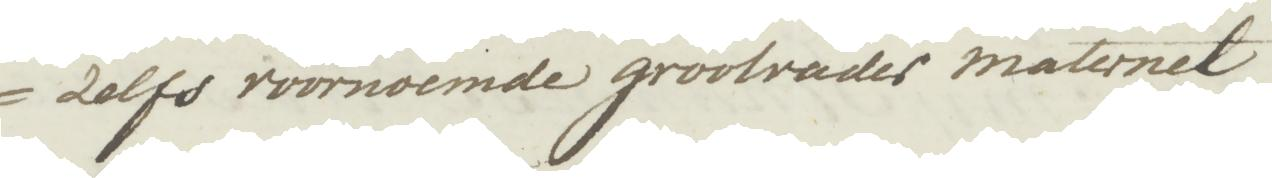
= zelfs voornoemde grootvader maternel
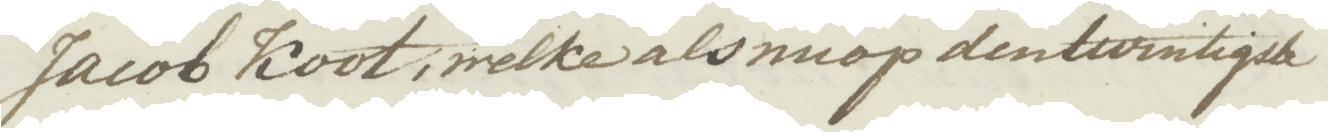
Jacob Koot, welke als nu op den twintigste
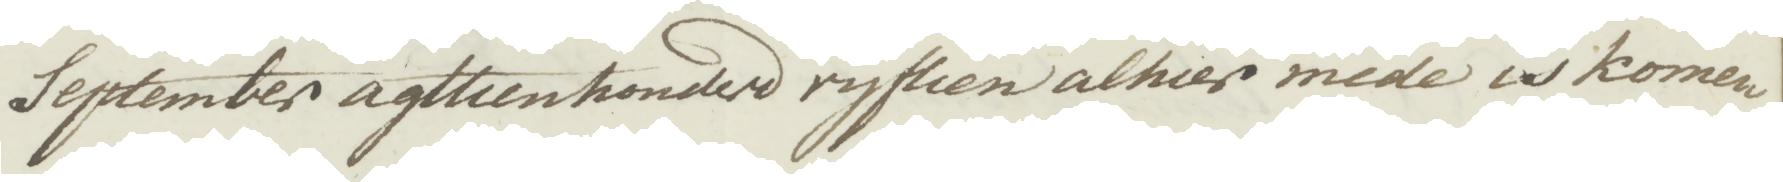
September agttienhonderd vijftien alhier mede is komen
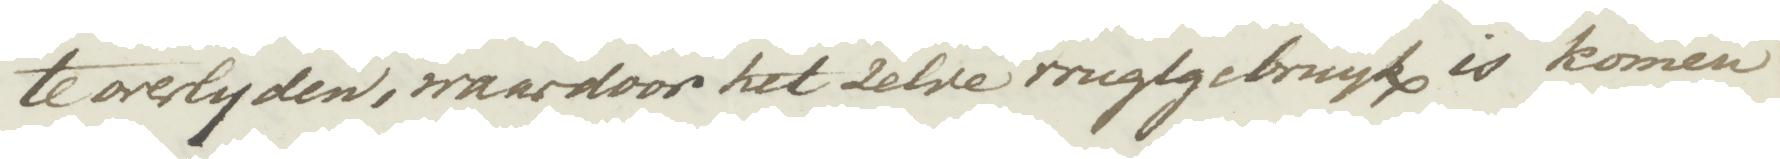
te overlyden, waar door het zelve vrugtgebruyk is komen
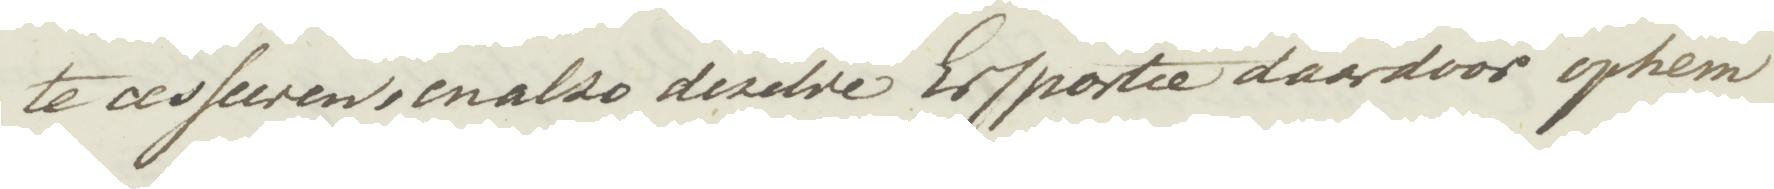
te cesseeren, en alzo dezelve Erfportie daar door op hem
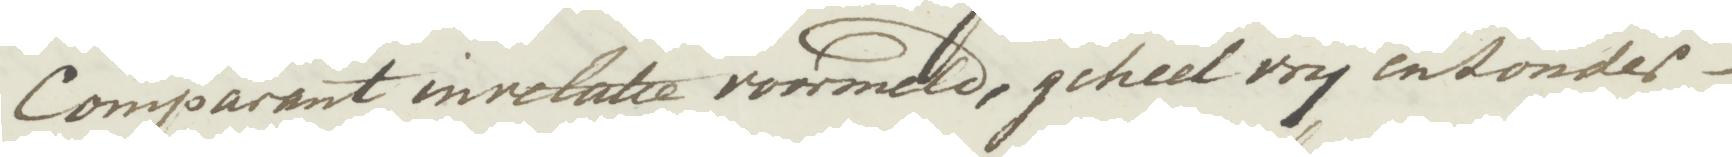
Comparant in relatie voormeld, geheel vry en zonder
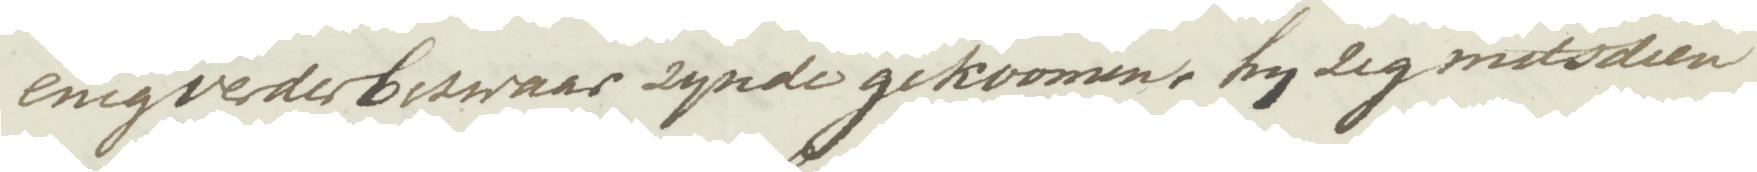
enig verder bezwaar zynde gekoomen, hij zig mitsdien
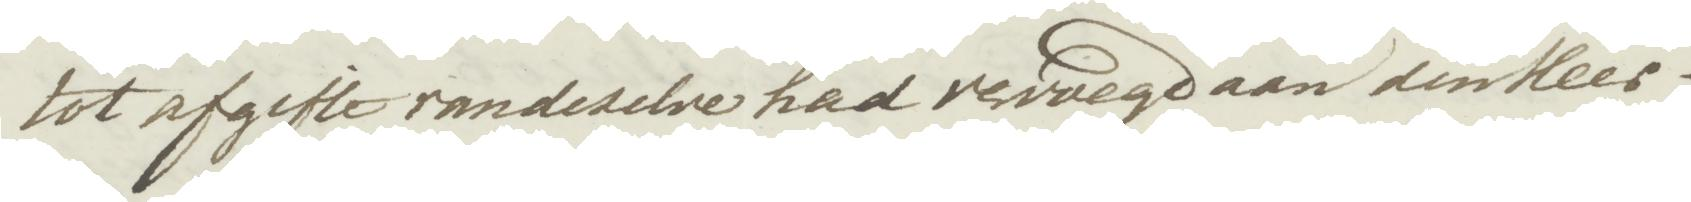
tot afgifte van dezelve had vervoegd aan den Heer
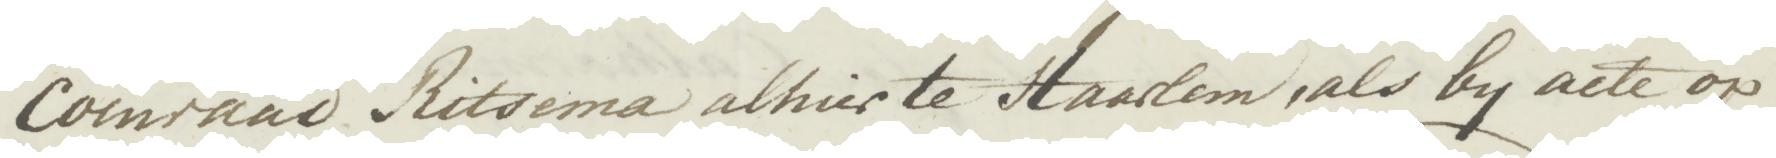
Coenraad Ritsema alhier te Haarlem, als bij acte op
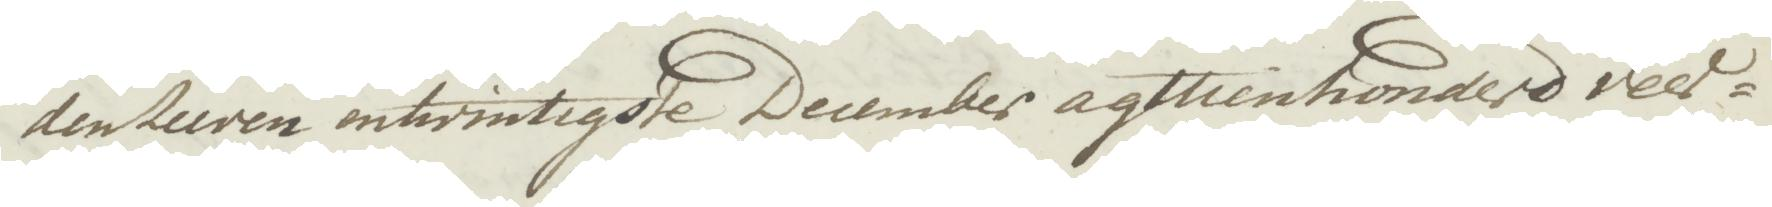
den zeeven en twintigste December agttienhonderd veer=
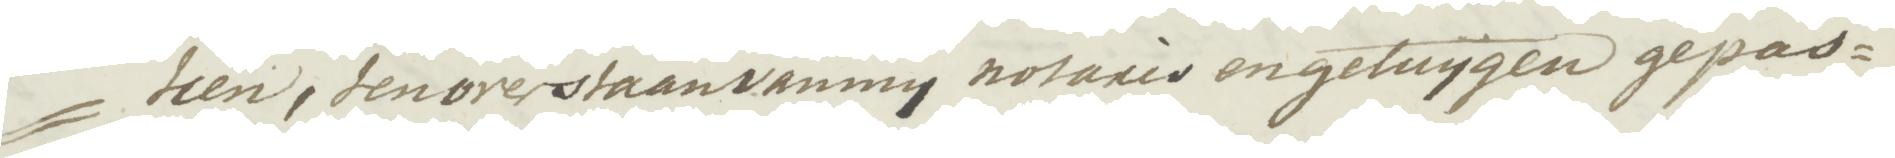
=tien, den overstaan van my notaris en getuygen gepas=
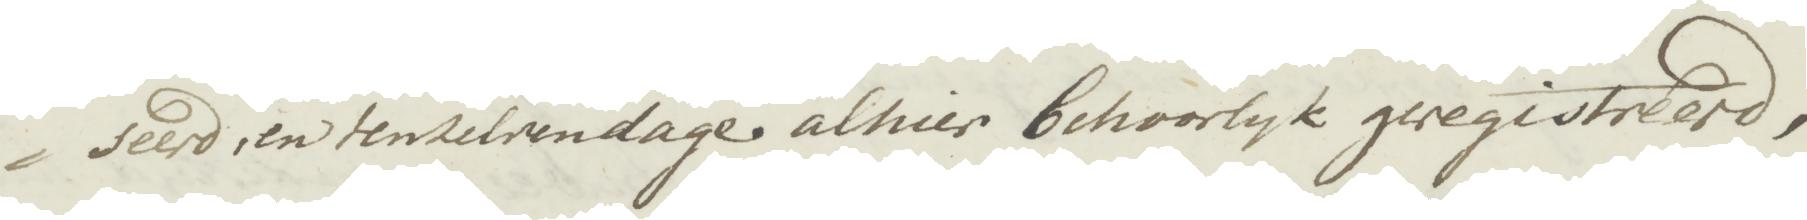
= seerd, en ten zelven dage alhier behoorlyk geregistreerd,
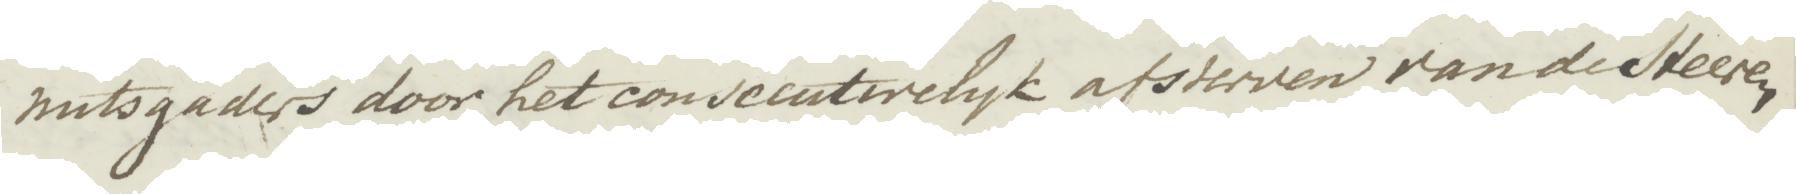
mitsgaders door het consecutivelyk afsterven van de Heere
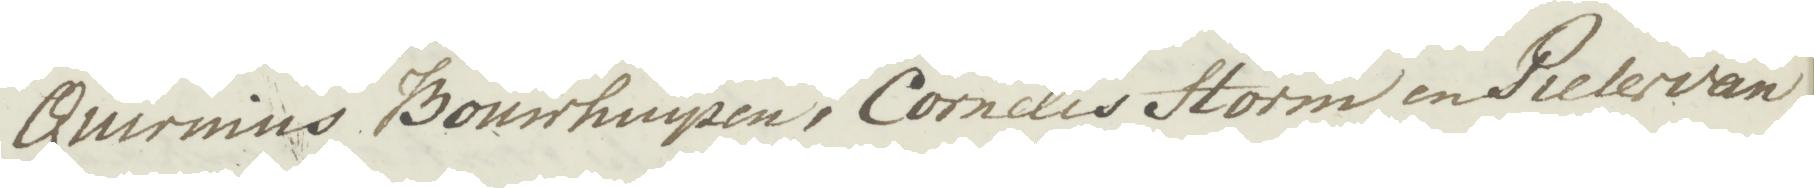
Quirinus Bouwhuyzen, Cornelis Storm en Pieter van
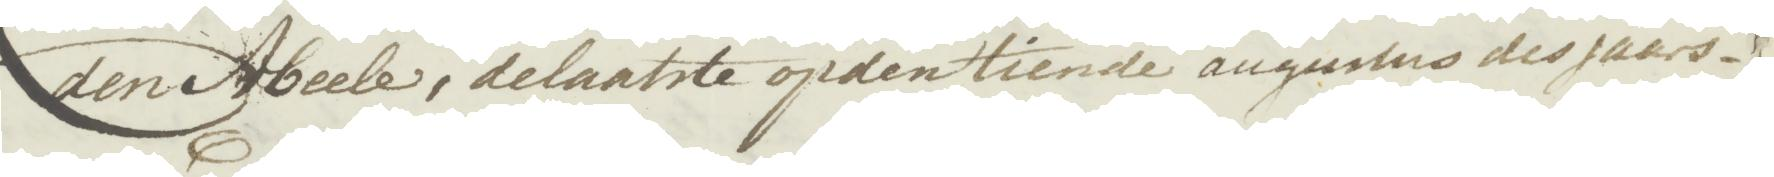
den Abeele, de laatste op den tiende augustus des jaars -
